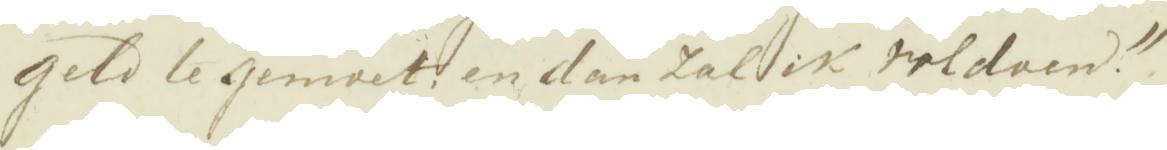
geld te gemoet, en dan zal ik voldoen."
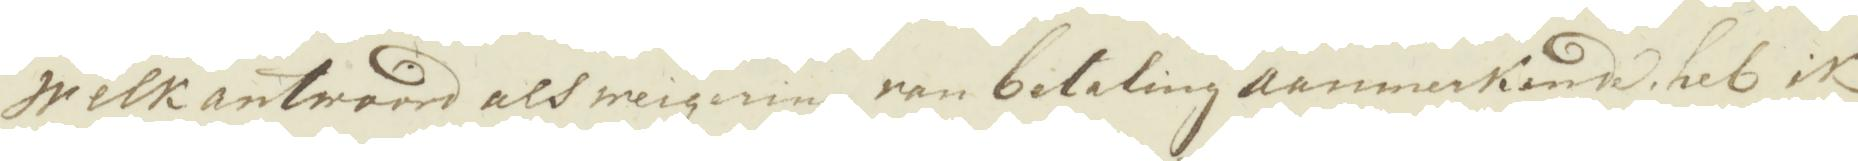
Welk antwoord als weigering van betaling aanmerkende, heb ik
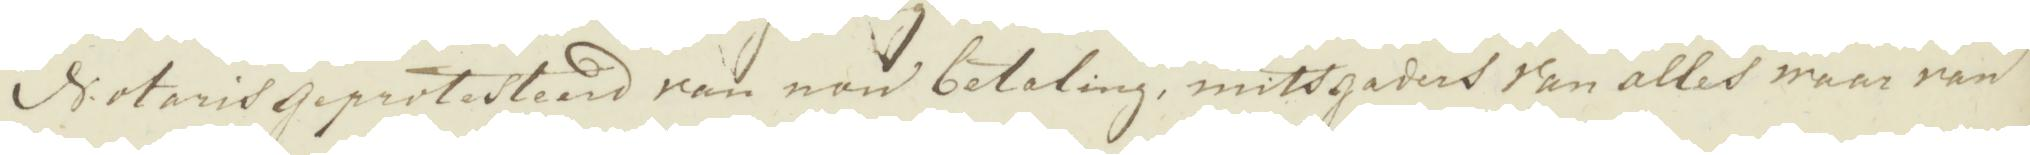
Notaris geprotesteerd van non betaling, mitsgaders van alles waar van
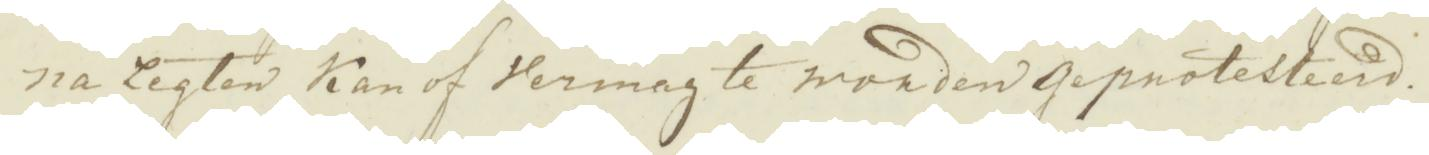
na regten kan of vermag te worden geprotesteerd.
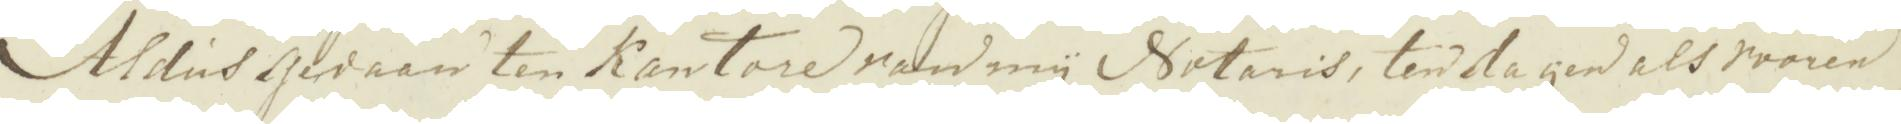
Aldus gedaan ten Kantore van mij Notaris, ten dagen als vooren
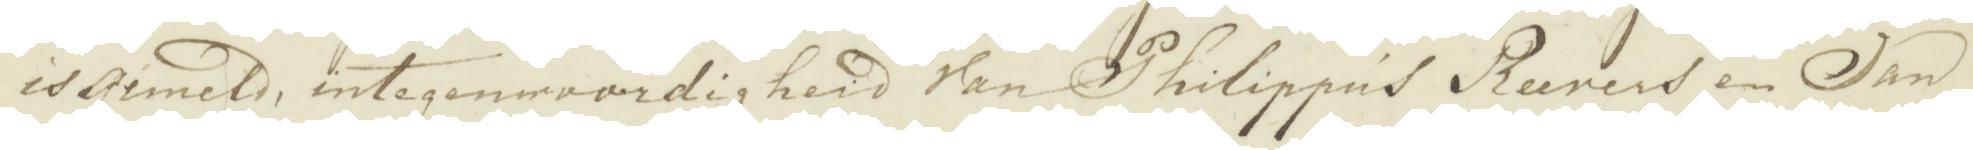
is gemeld, integenwoordigheid van Philippus Reevers en Ian
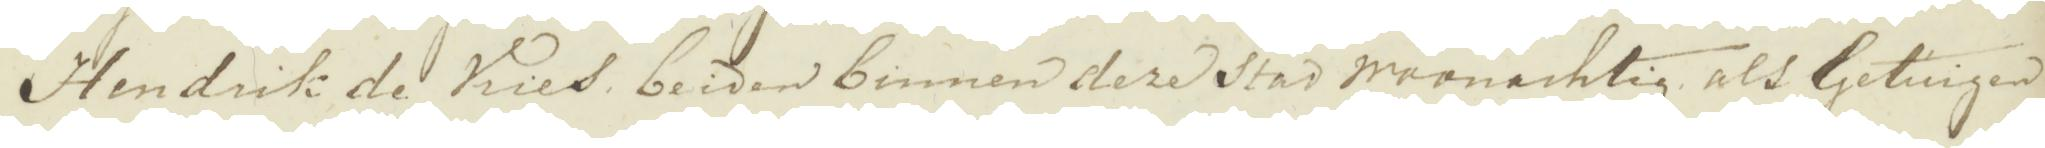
Hendrik de Vries, beiden binnen deze stad woonachtig, als Getuigen
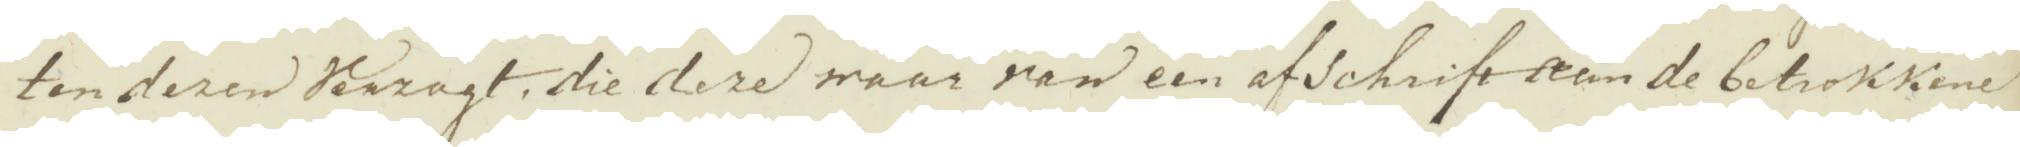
ten dezen Verzogt, die deze waar van een afschrift aan de betrokkene
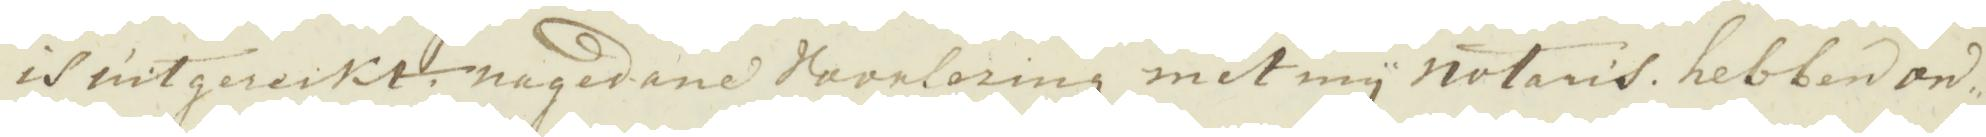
is uitgereikt, nagedane voorlezing met mij notaris, hebben on„
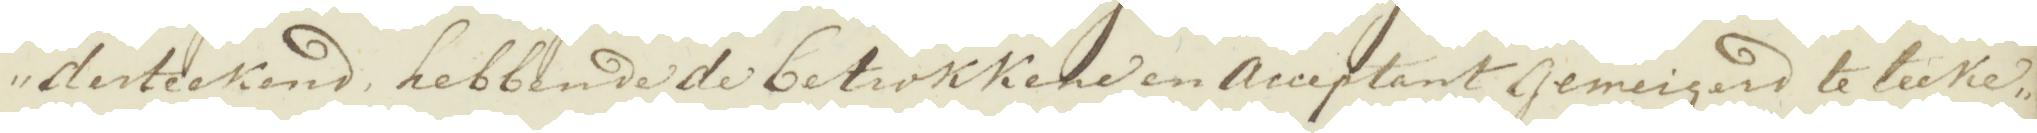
„derteekend, hebbende de betrokkene en acceptant geweigerd te teeke„
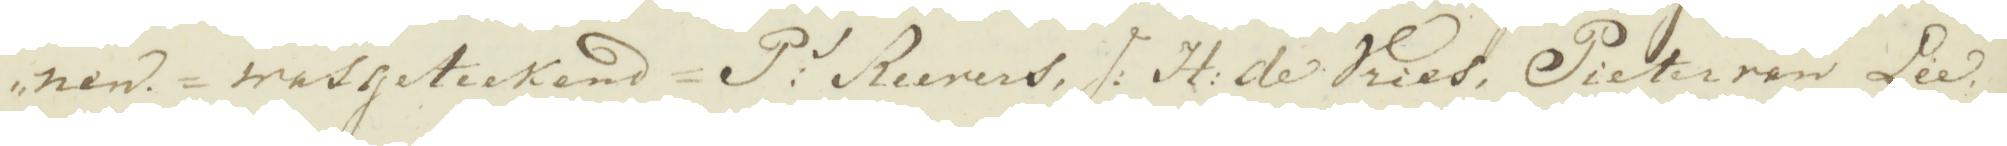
„nen. - was geteekend = P:s Reevers, J: H: de Vries, Pieter van Lee,
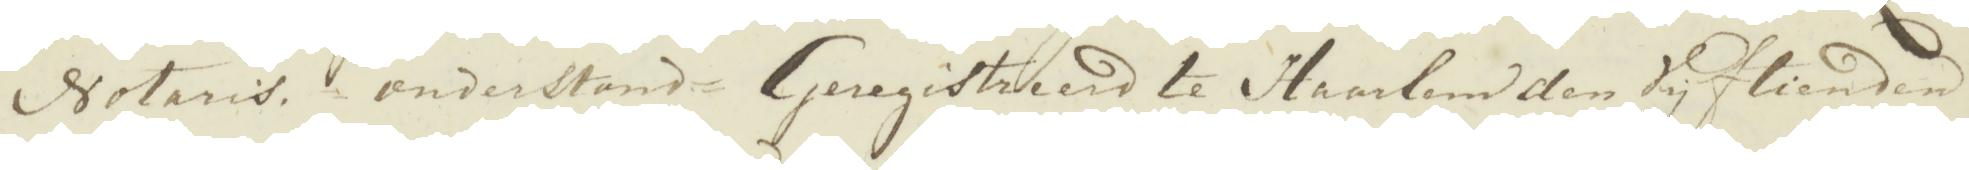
Notaris, = onderstond= Geregistreerd te Haarlem den Vijftienden
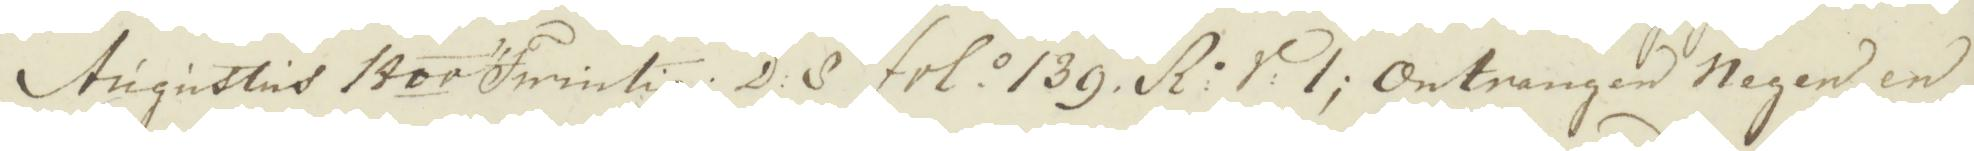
Augustus 1800 Twintig; D: 8 fol:o 139. R:o V: 1; Ontvangen Negen en
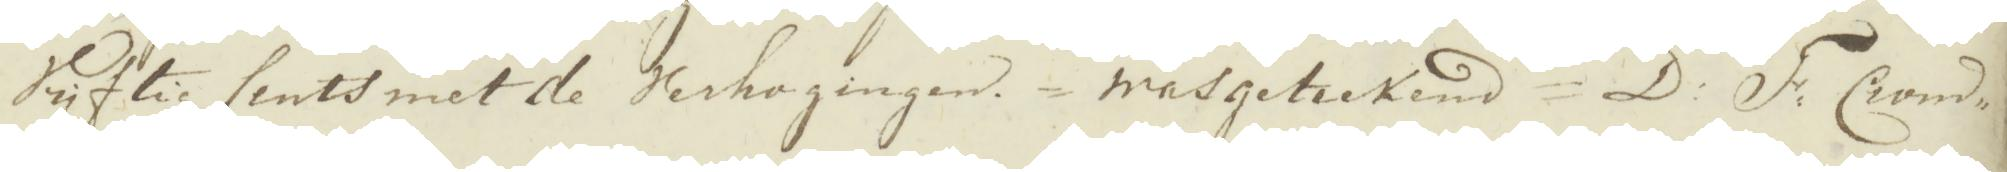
Vijftig Cents met de Verhogingen. = was geteekend = D: F: Crom„
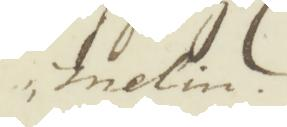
„melin
